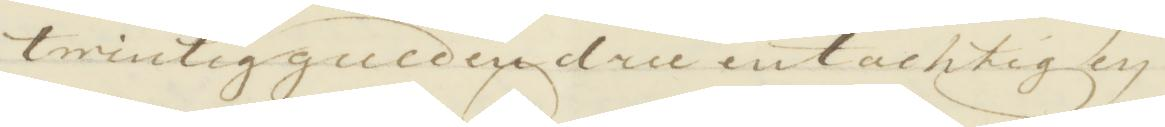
twintig gulden drie entachtig en
